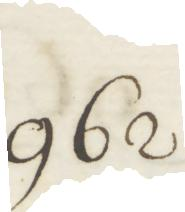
962
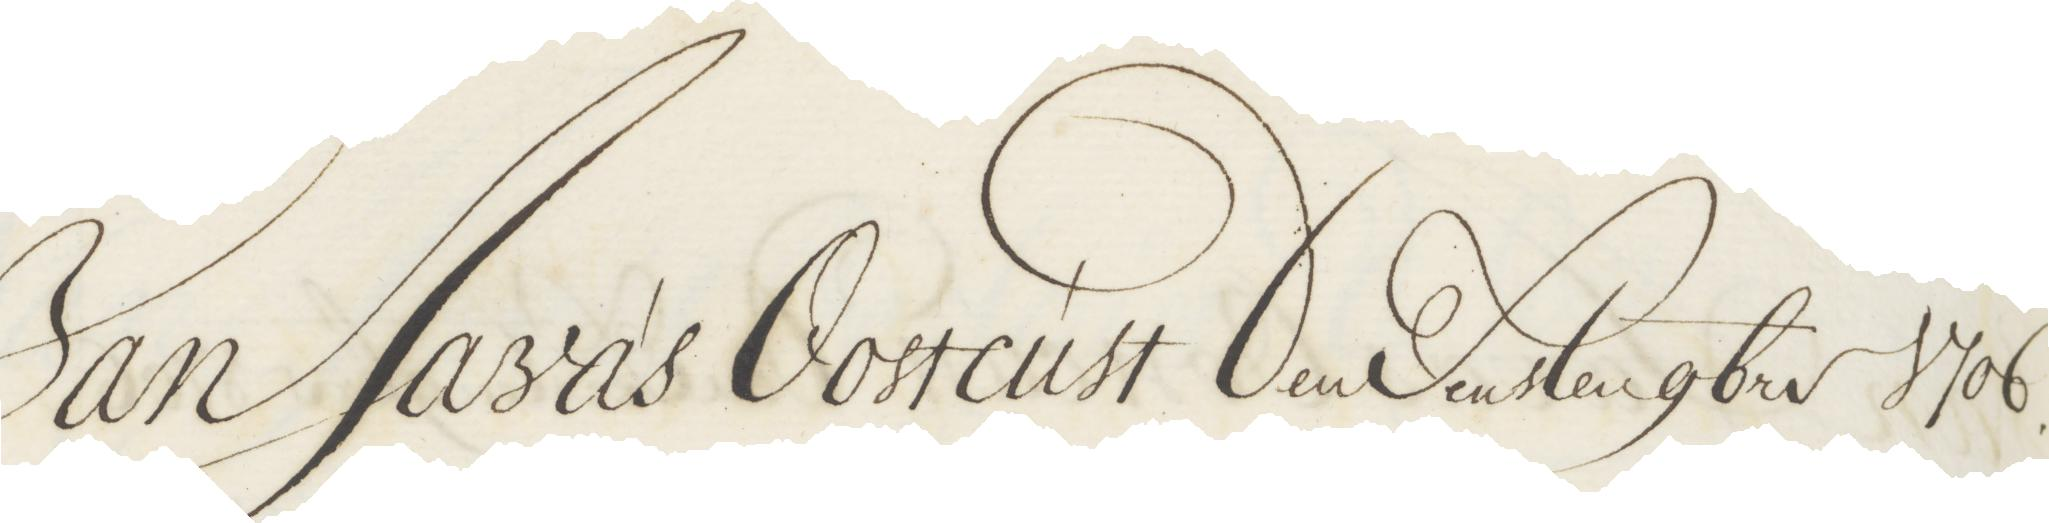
Van Java's Oostcust den Eersten 9bre 1706.
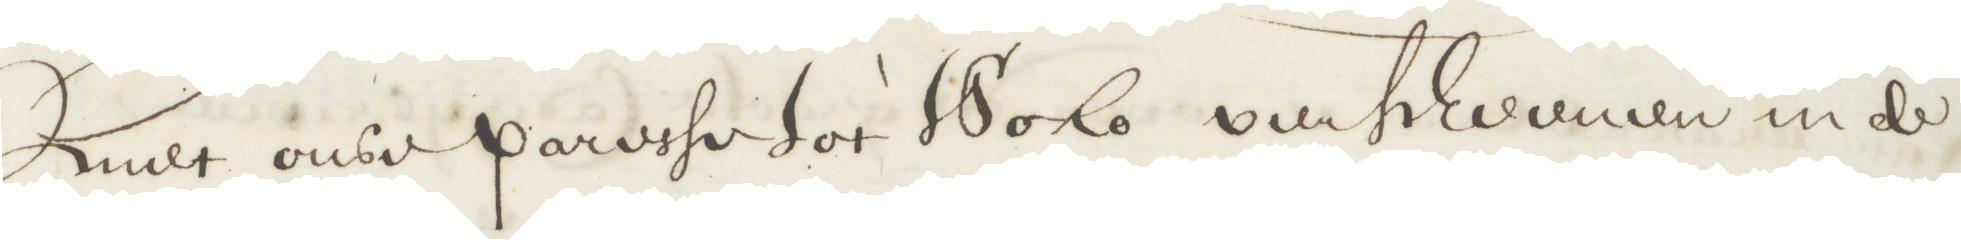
met onse paresse tot 't Soko verscheenen in de
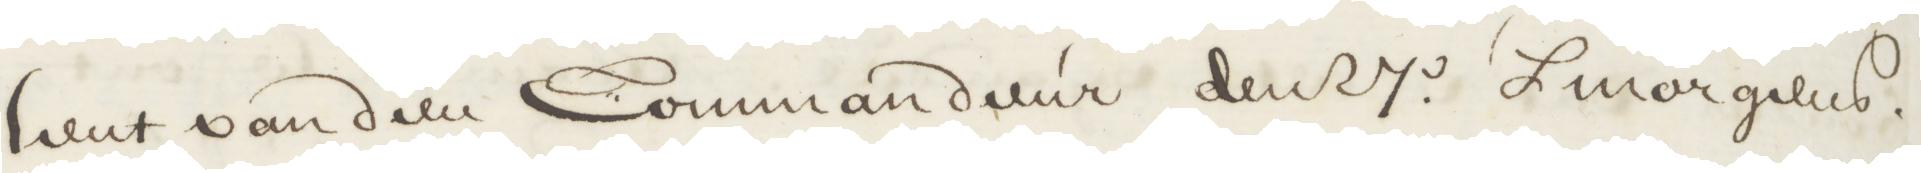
tent van den Commandeur den 27:e 'Smorgens.
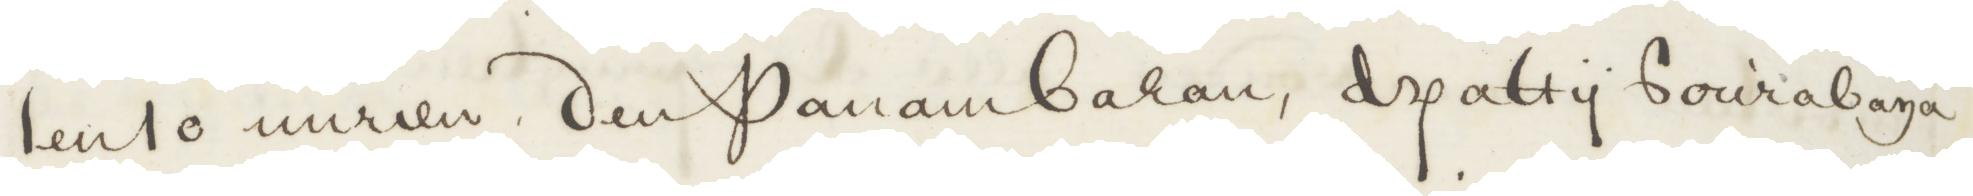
ten 10 uuren den Panambahan, depattij Sourabaija
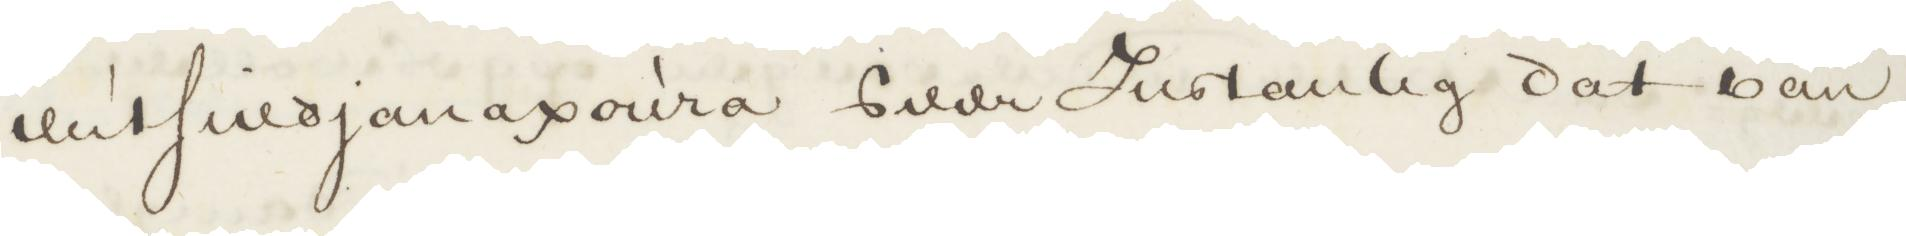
en't Siedjanapoura seer Instantig dat van
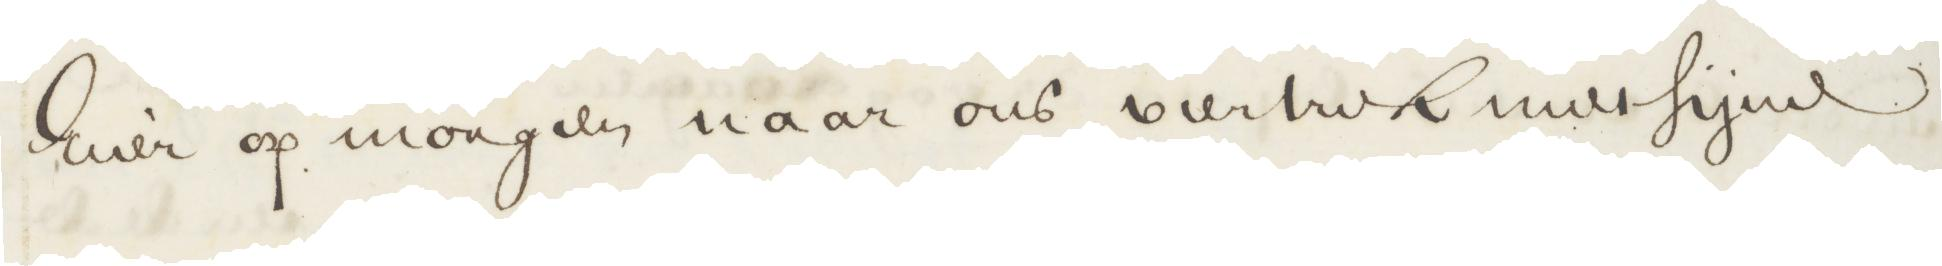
hier op morgen naar ons vertrek met Sijne
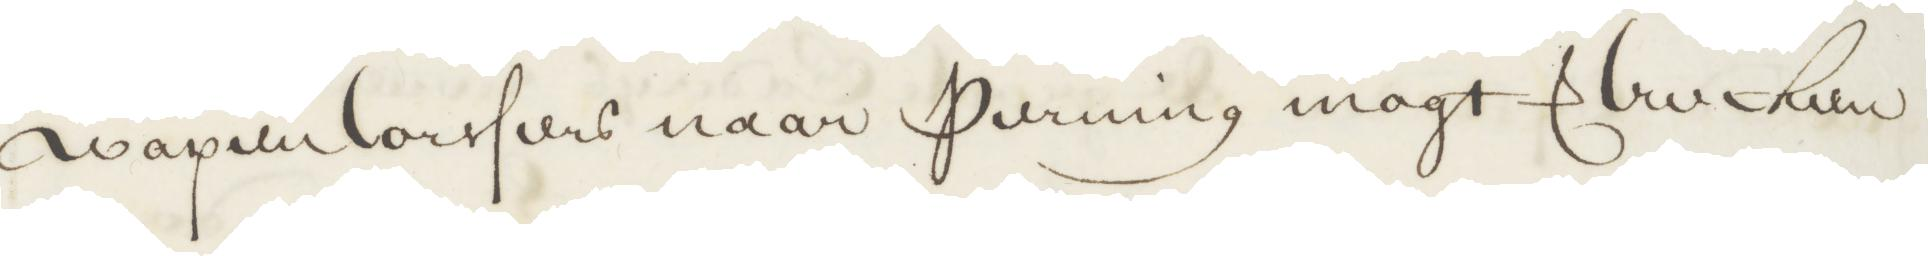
wapentorssers naar Perning mogt vertrecken
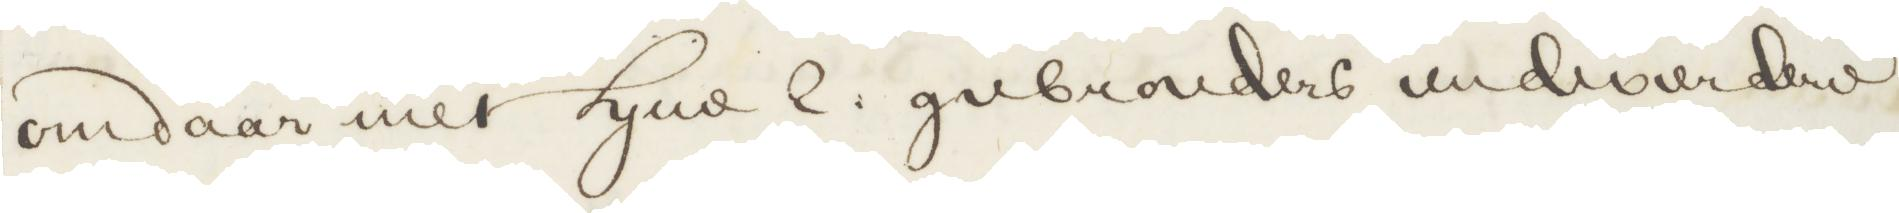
om daar met Sijne 2: gebroeders en de verdere
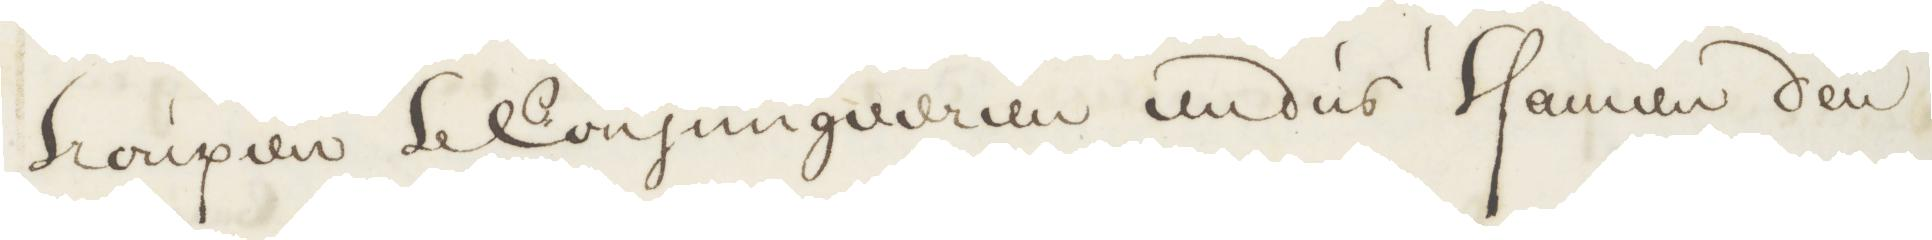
troupen te Conjungeeren en dus 'tsamen den
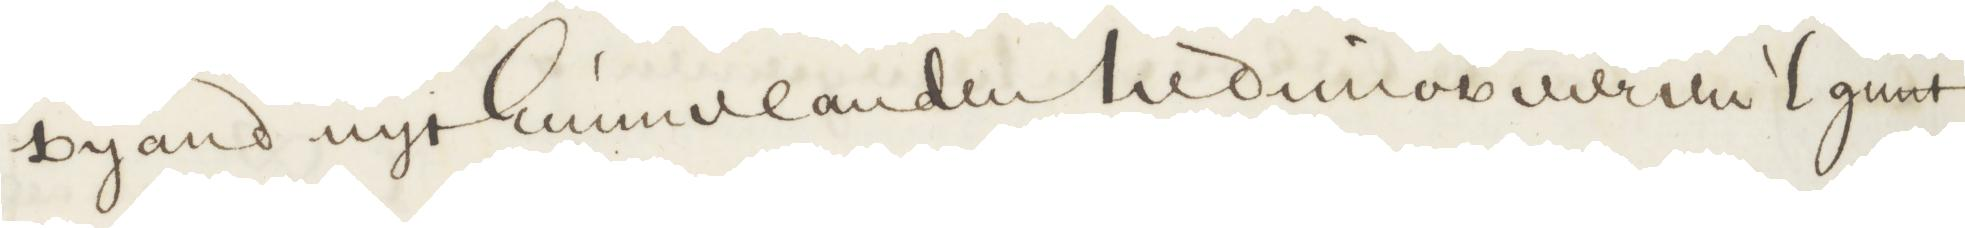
vijand uijt hunne landen te dimoveeren ’t gunt
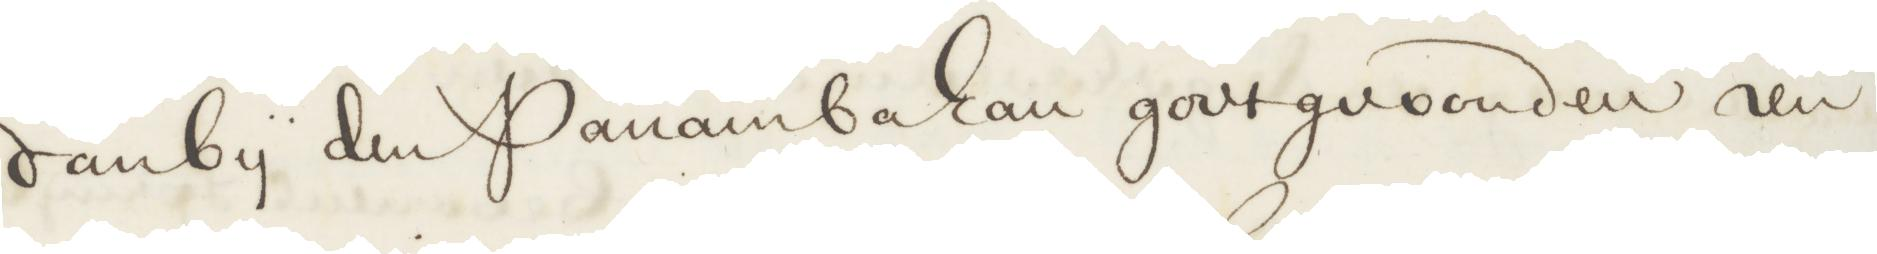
dan bij den Panambahan goet gevonden en
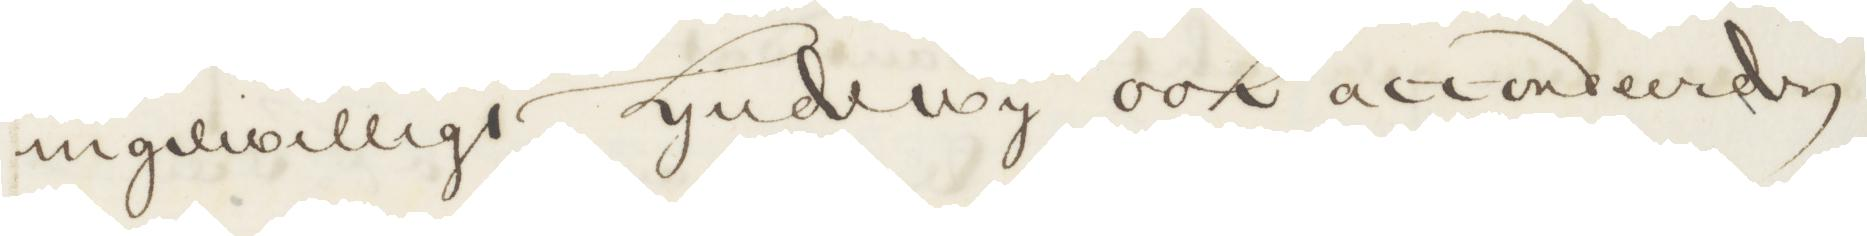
ingewilligt sijnde wij ook accordeerden
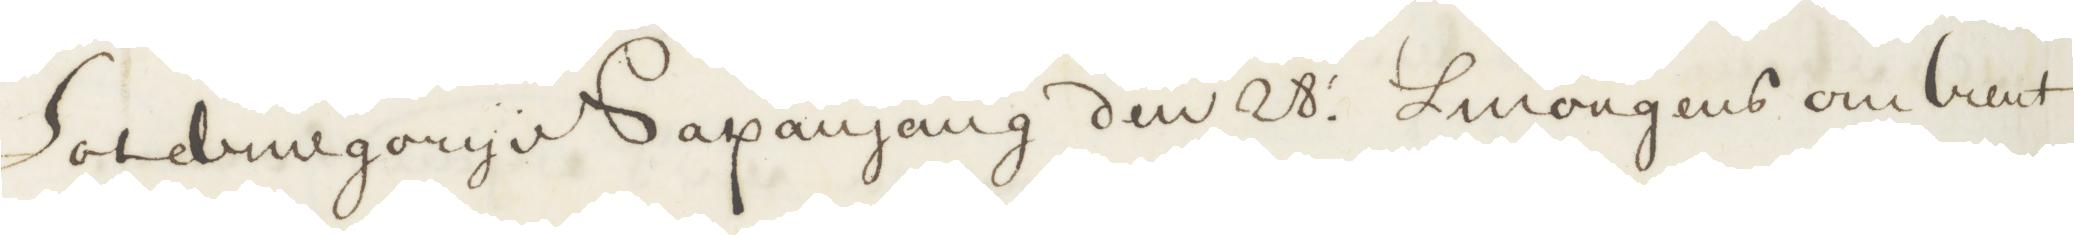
tot de negorije Sapanjang den 28: 'Smorgens omtrent
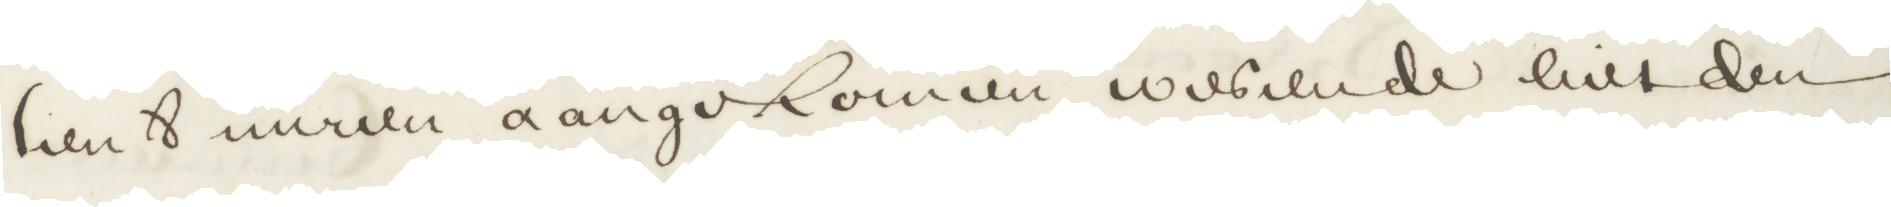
ten 8 uuren aangekomen wesende liet den
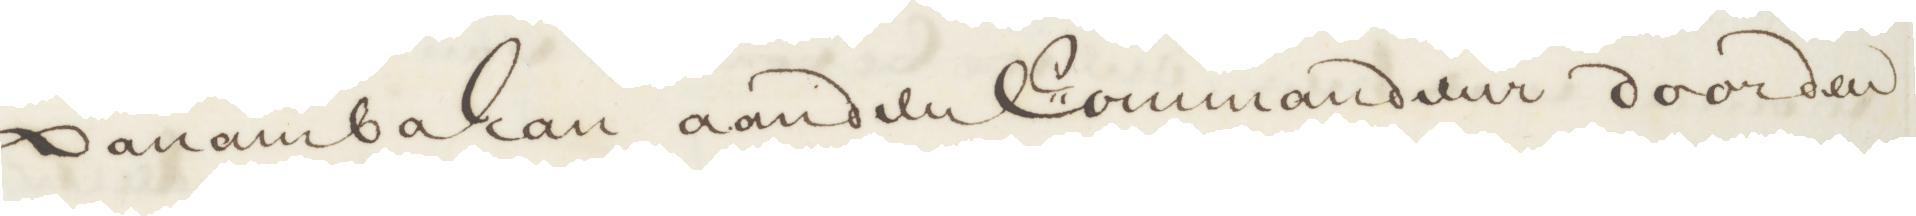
panambahan aan den Commandeur door den
